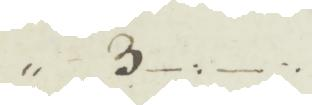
„ 3 —: —:
